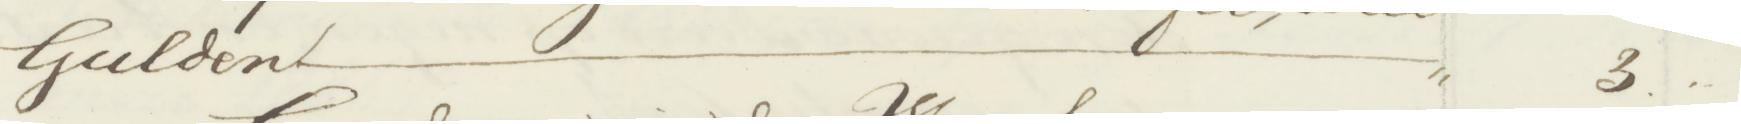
Gulden—„ 3.„
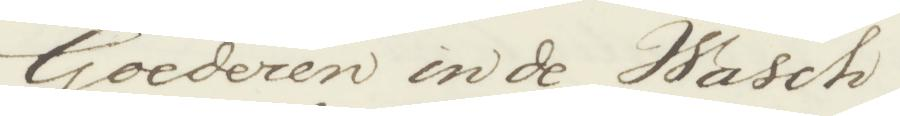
Goederen in de Wasch
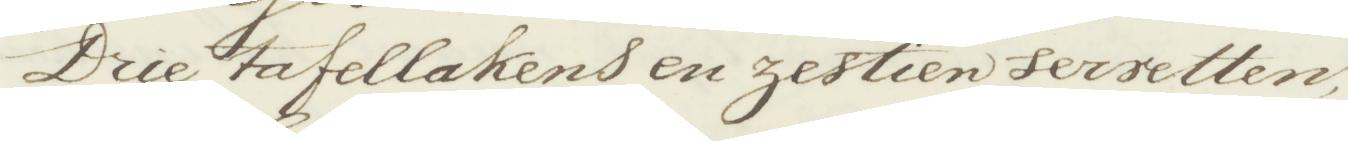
Drie tafellakens en zestien servetten,
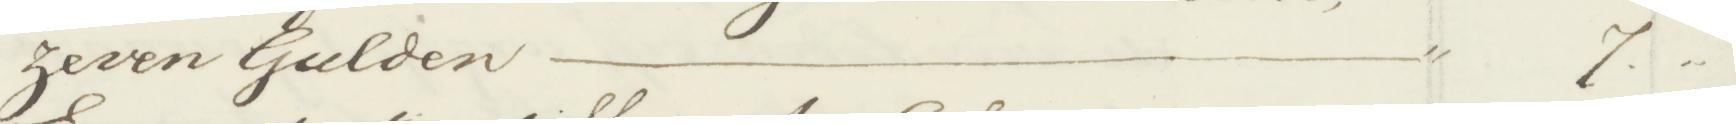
zeven Gulden—„ 7.„
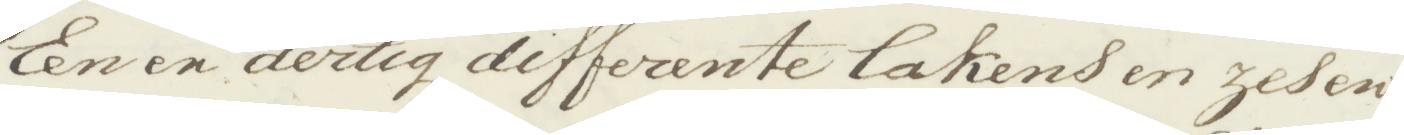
Een en dertig differente lakens en zes en
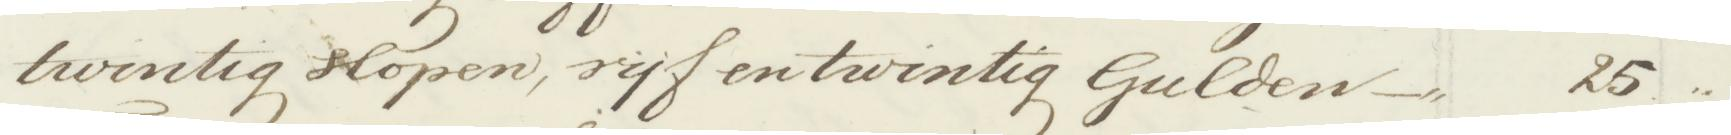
twintig slopen, vijf en twintig Gulden —„ 25.„
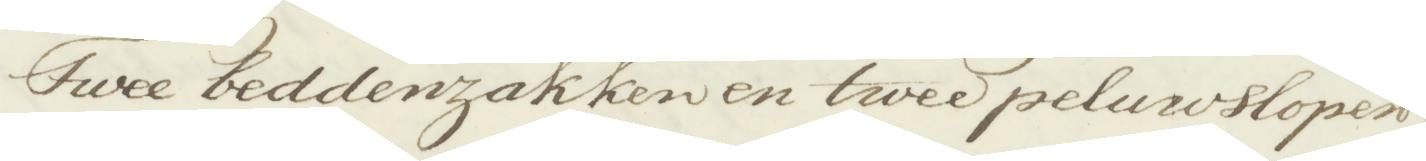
Twee beddenzakken en twee peluwslopen
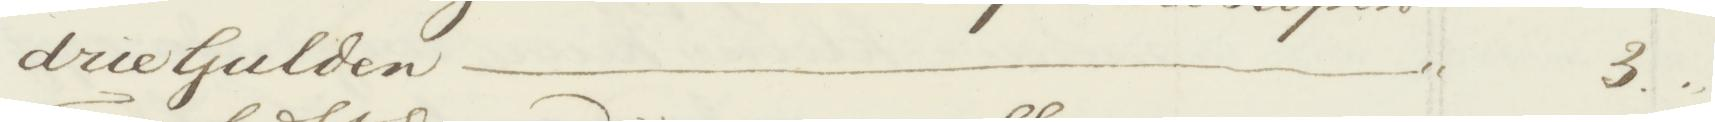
drie Gulden—„ 3. „
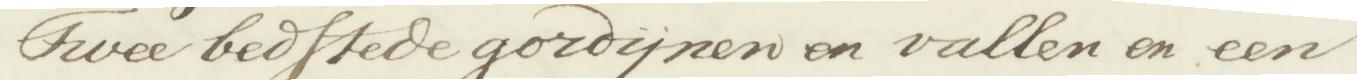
Twee bedstede gordijnen en vallen en een
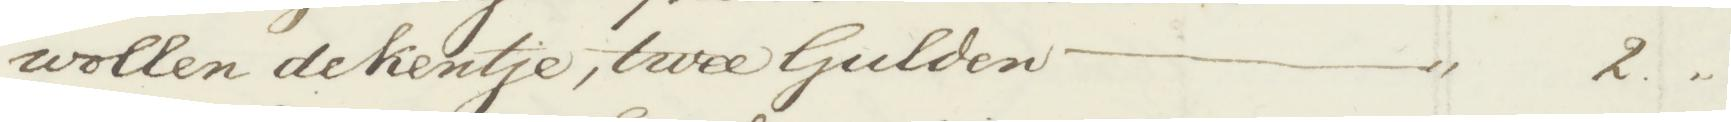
wollen dekentje, twee Gulden —„ 2.„
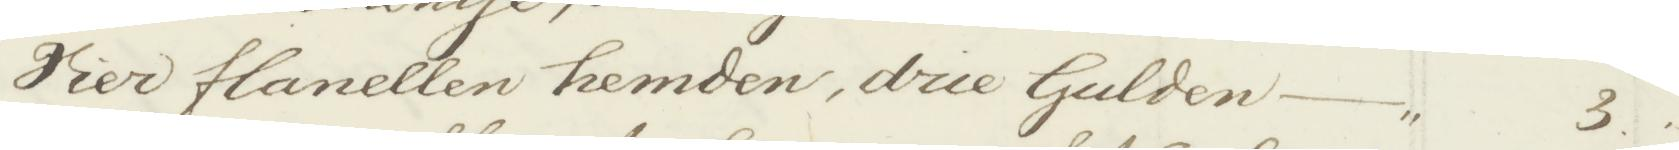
Vier flanellen hemden, drie Gulden—„ 3.„
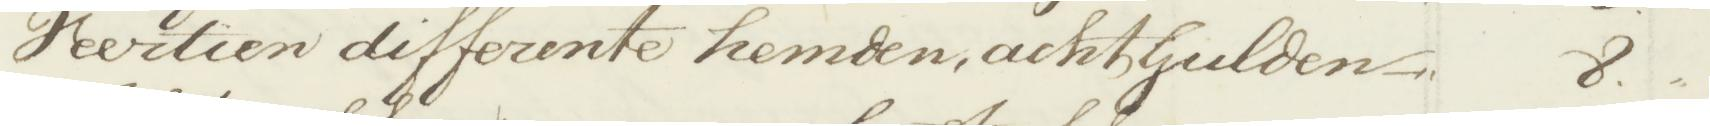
Veertien differente hemden, acht Gulden—„ 8.„
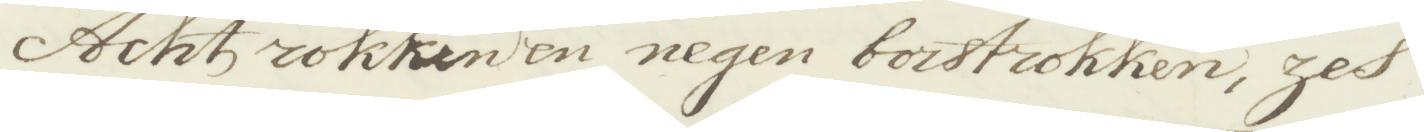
Acht rokken en negen borstrokken, zes
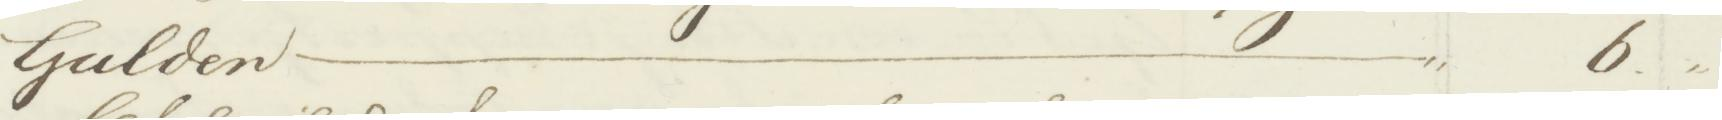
Gulden—„ 6.„
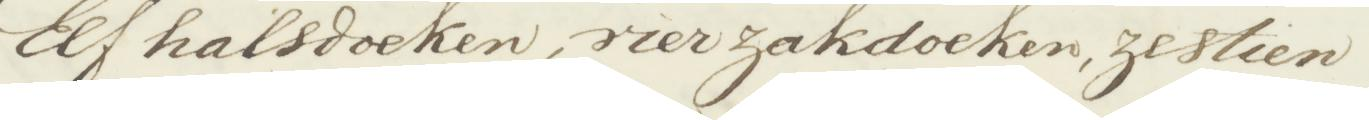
Elf halsdoeken, vier zakdoeken, zestien
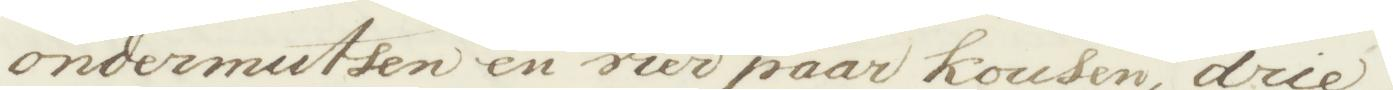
ondermutsen en vier paar kousen, drie
